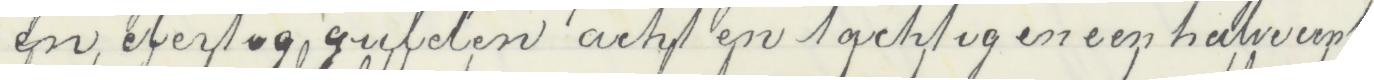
en dertig gulden acht en tachtig en een halve cent
